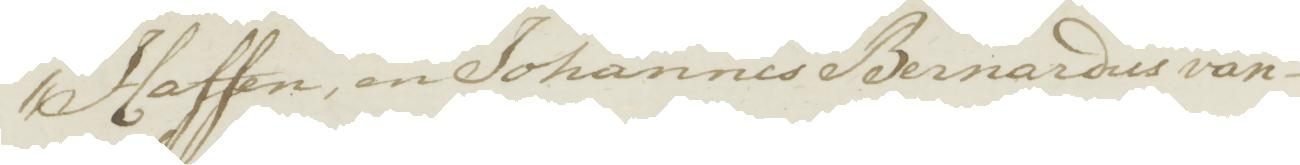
Haffen, en Johannes Bernardus van
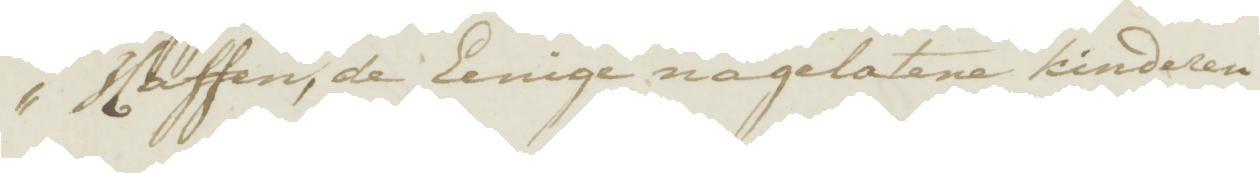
„ Haffen, de Eenige nagelatene kinderen
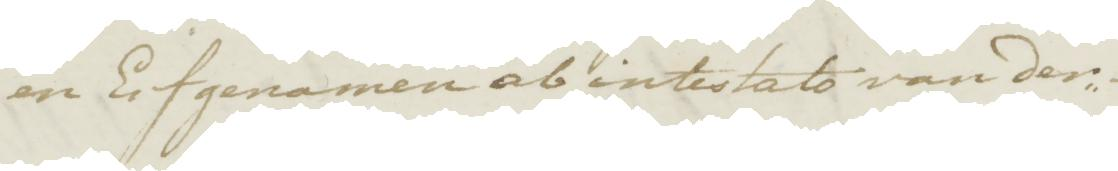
en Erfgenamen ab intestato van der„
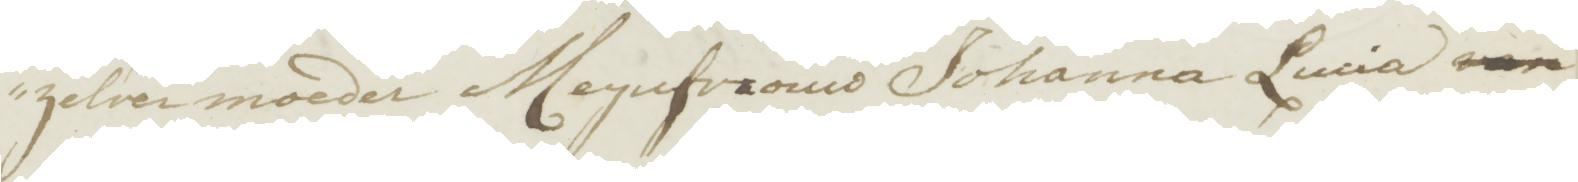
„zelven moeder Mejufvrouw Johanna Lucia van
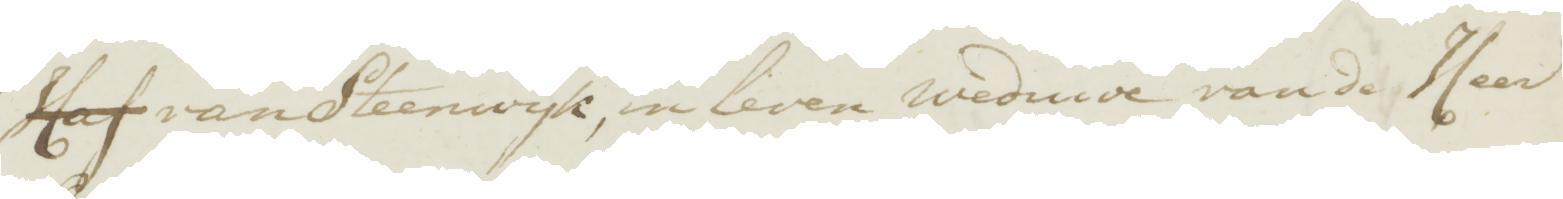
„Haf van Steenwyk, in leven weduwe van de Heer
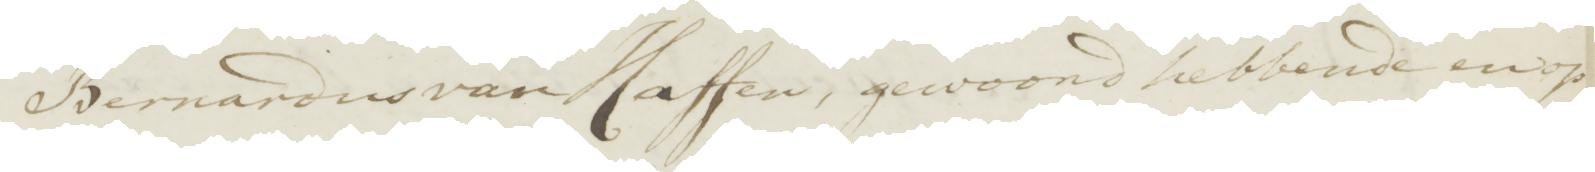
Bernardus van Haffen, gewoond hebbende en op
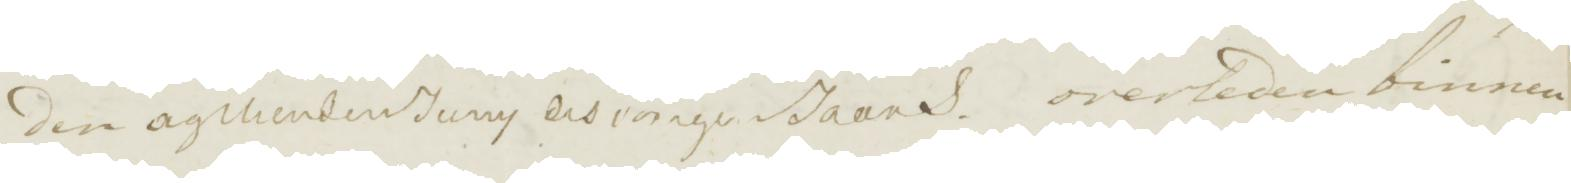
den agttienden Iuny des vorigen Iaars. overleden binnen
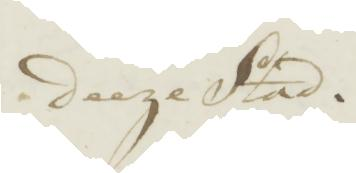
deeze Stad.
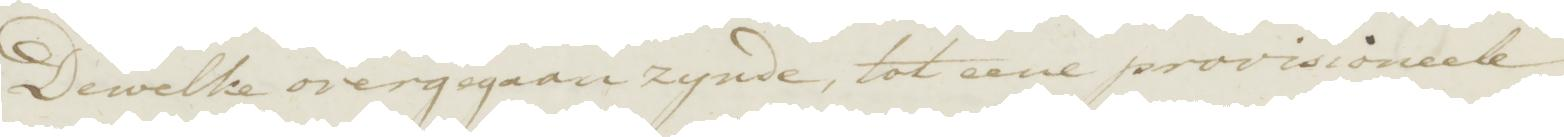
Dewelke overgegaan zynde, tot eene provisioneele
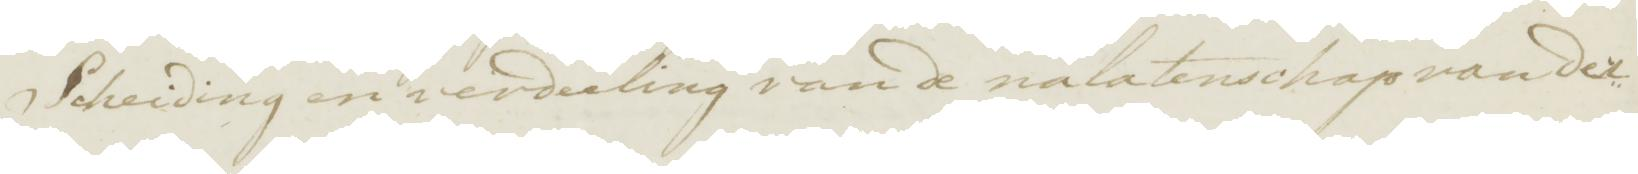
scheiding en verdeeling van de nalatenschap van der„
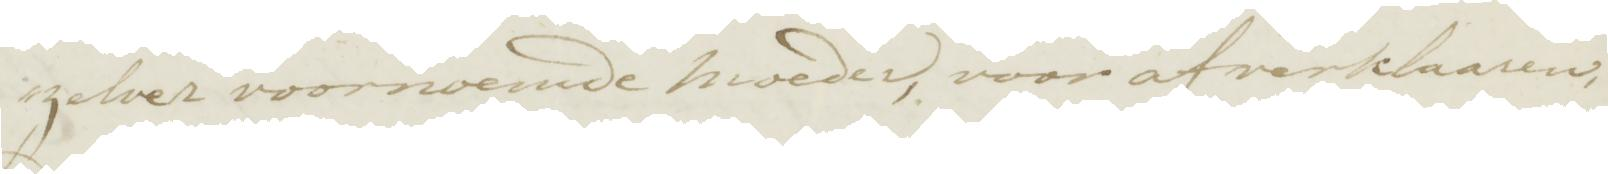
„zelver voornoemde moeder, voor af verklaaren,
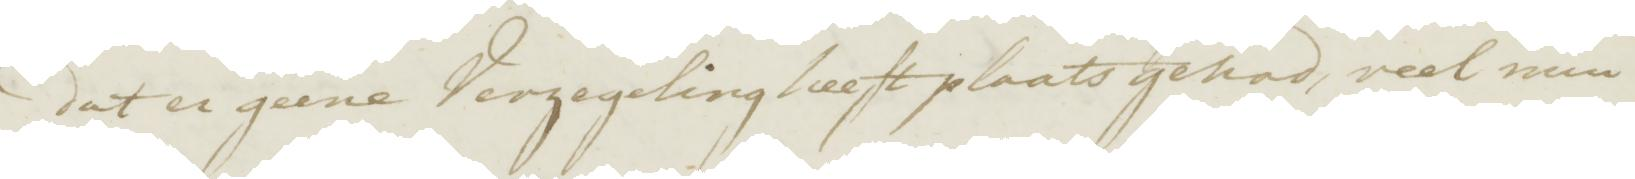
dat er geene Verzegeling heeft plaats gehad, veel min
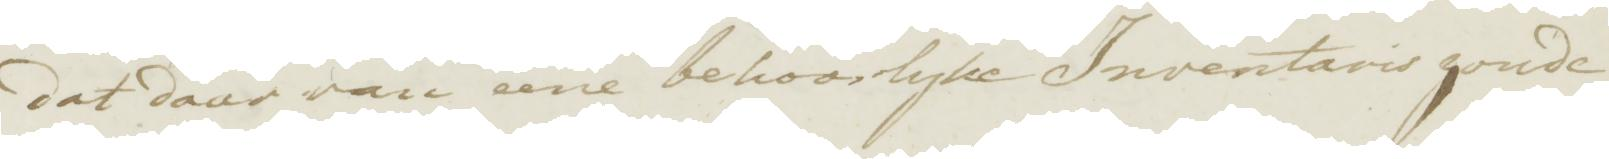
dat daar van eene behoorlyke Inventaris zoude
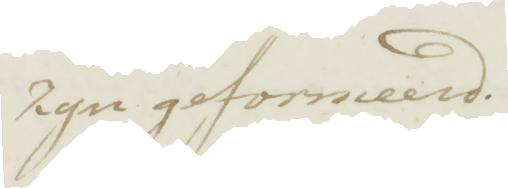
zyn geformeerd.
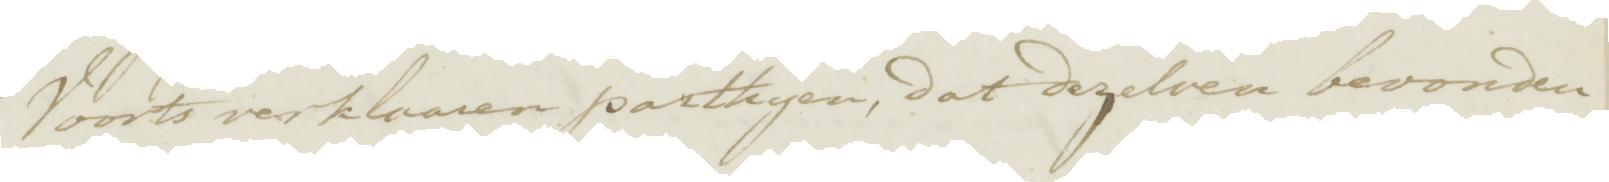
Voorts verklaaren parthyen, dat dezelven bevonden
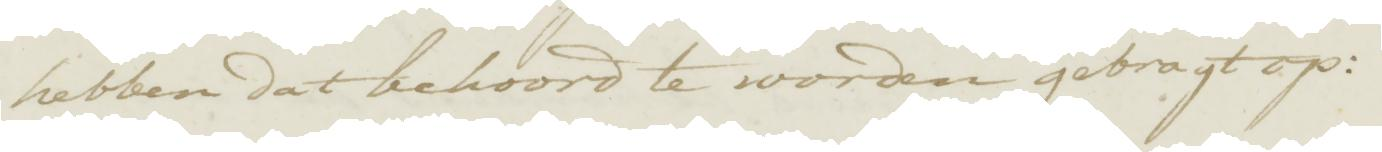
hebben dat behoord te worden gebragt op:
